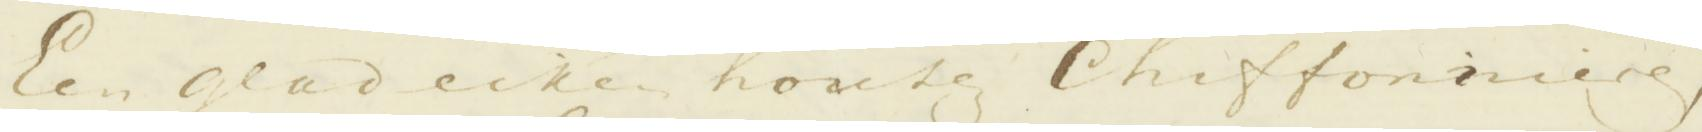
Een glad eiken houten Chiffonniere,
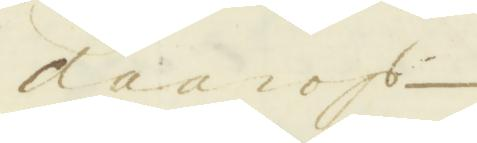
daarop—
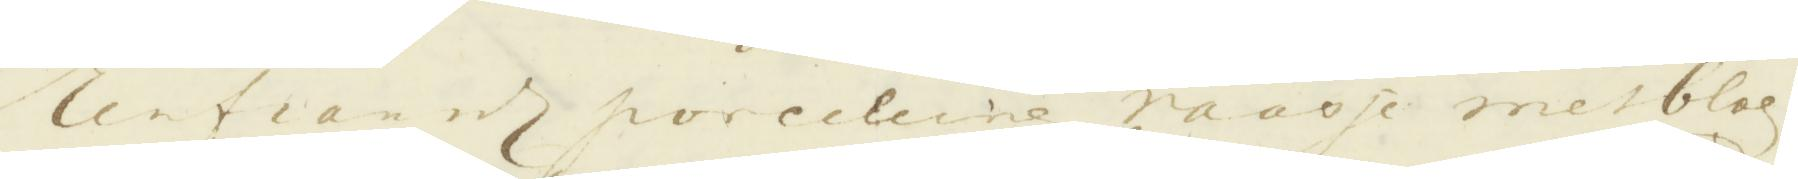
Een fransch porceleinen vaasje met bloe
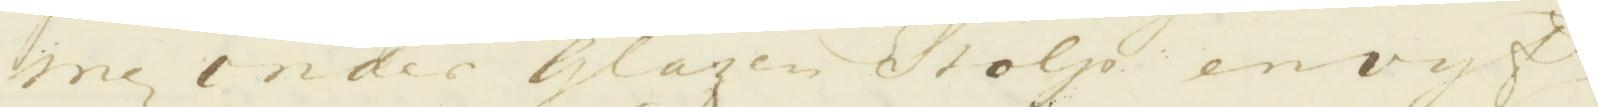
men onder Glazen Stolp en vyf
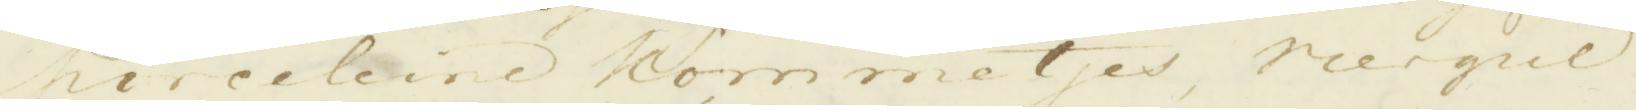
porceleine kommetjes, vier gul
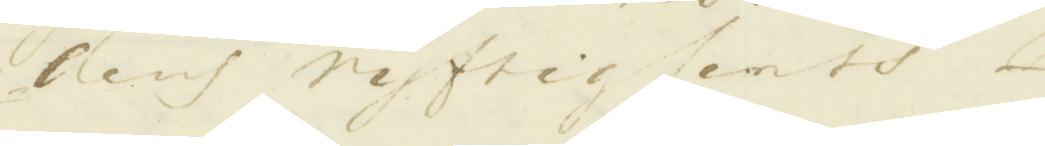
dens vyftig Cents
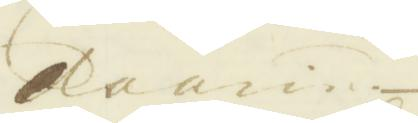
daan.
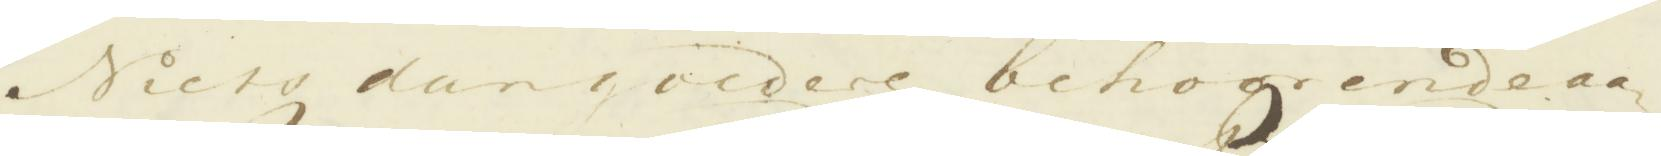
Niets dan goederen behoorende aan
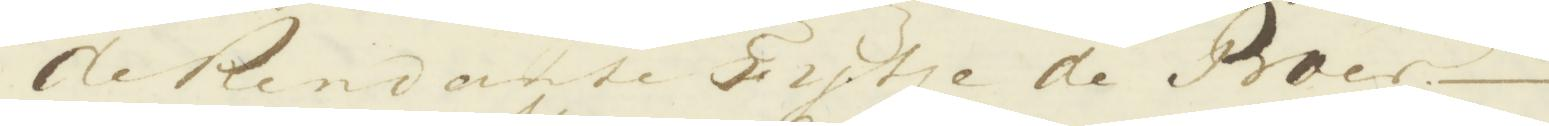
de Rendante Fytje de Boer.
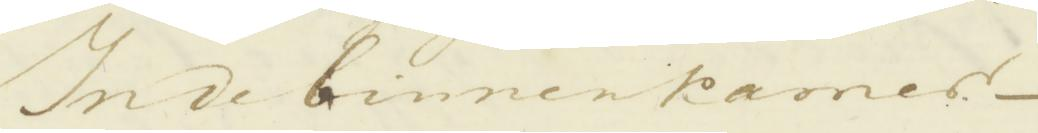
In de binnen kamer.-
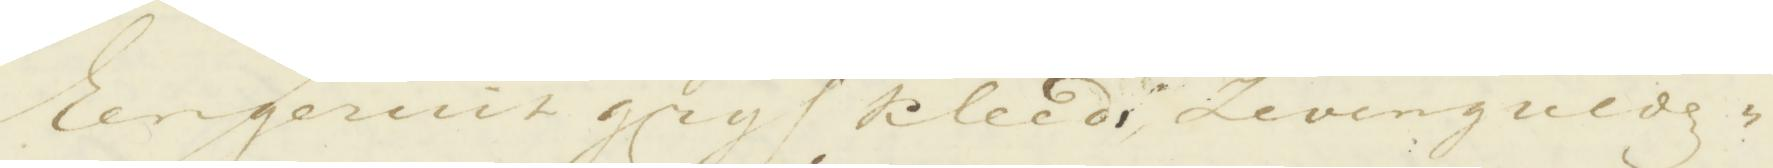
Een geruit grys kleeds, zeven gulden „
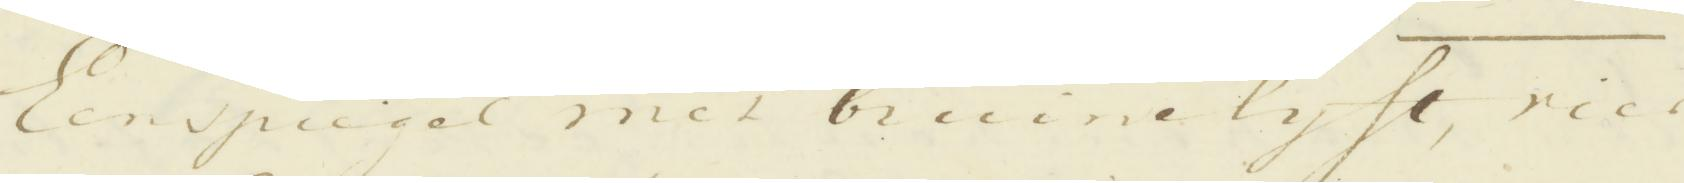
Een spiegel met bruine lyst, vier
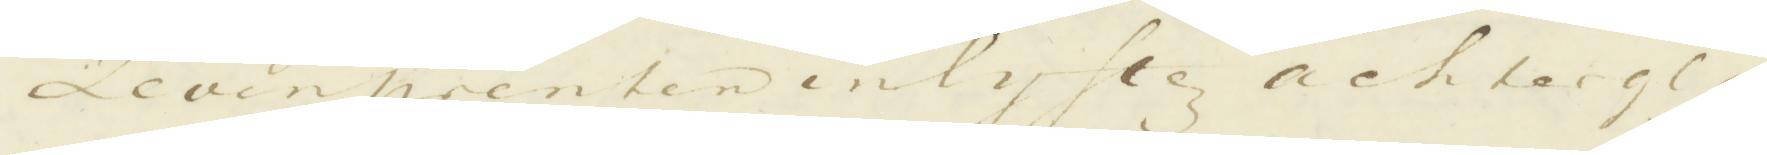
Zeven prenten in lysten achter glas
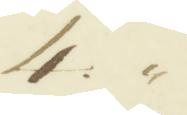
4: „
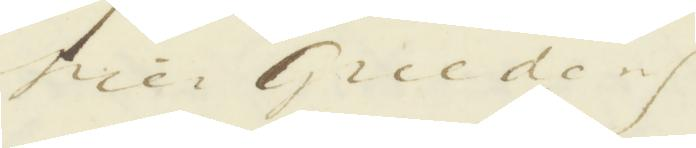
vier Guldens
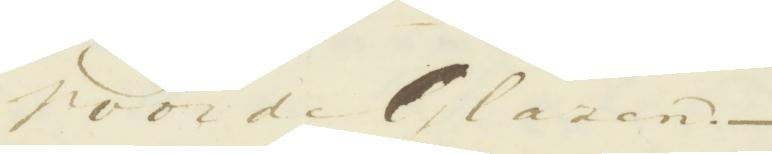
voor de Glazen.—
